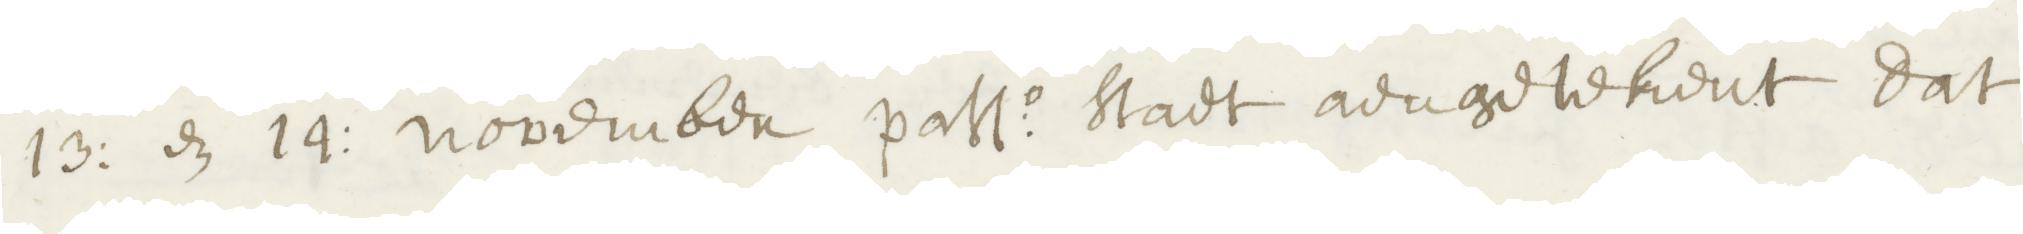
13: en 14: november pass:o staet aengetekent dat
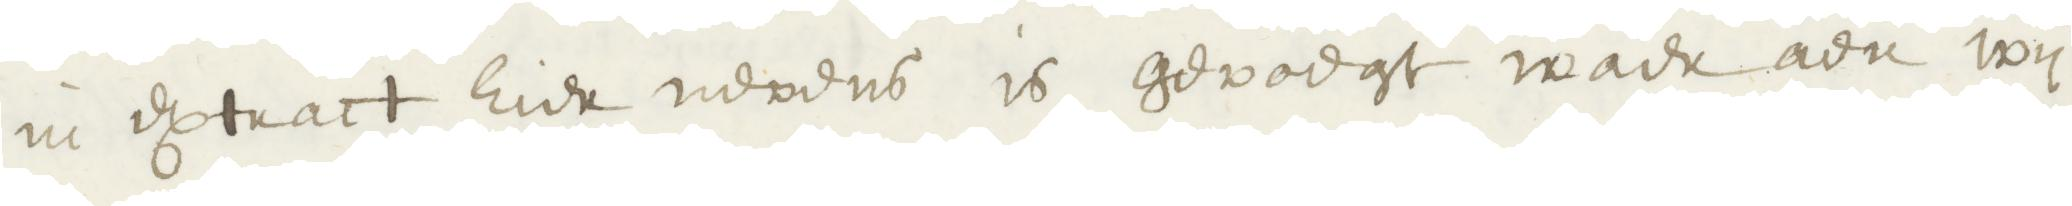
in extract hier nevens is gevoegt waer aen wij
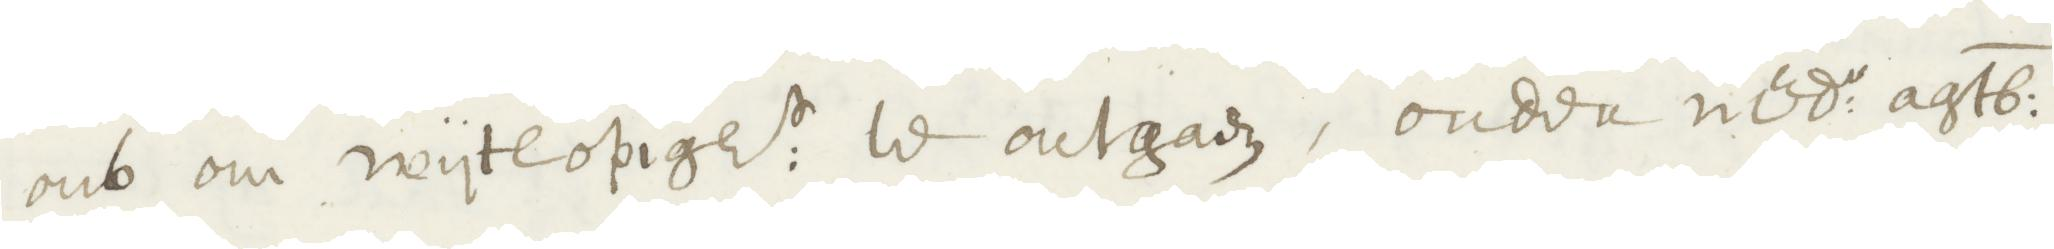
ons om wijtlopigh:t te ontgaen, onder uEd:s agtb:
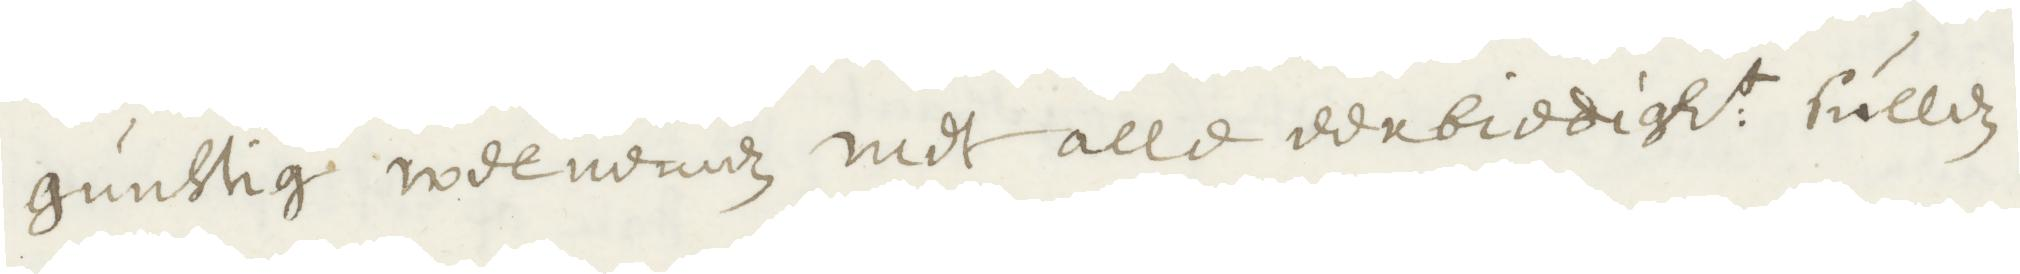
gunstig welnemen met alle eerbiedigh:t sullen
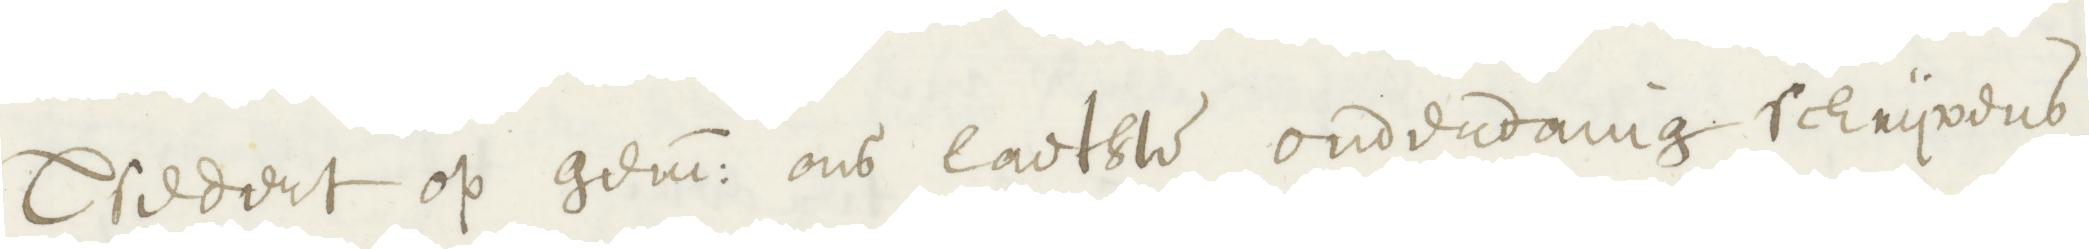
Tsedert op gem: ons laetste onderdanig schrijvens
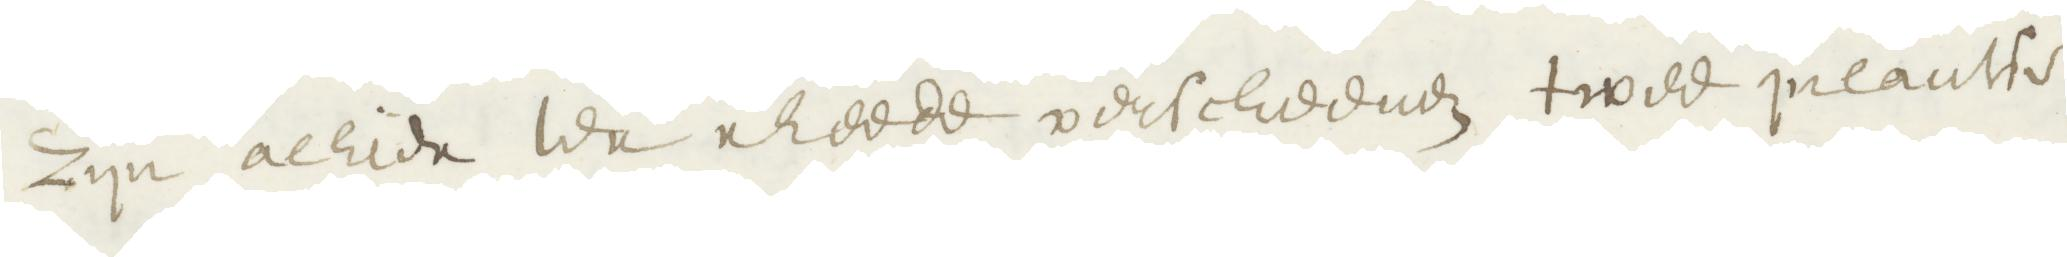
zijn alhier ter rheede verscheenen twee inlantse
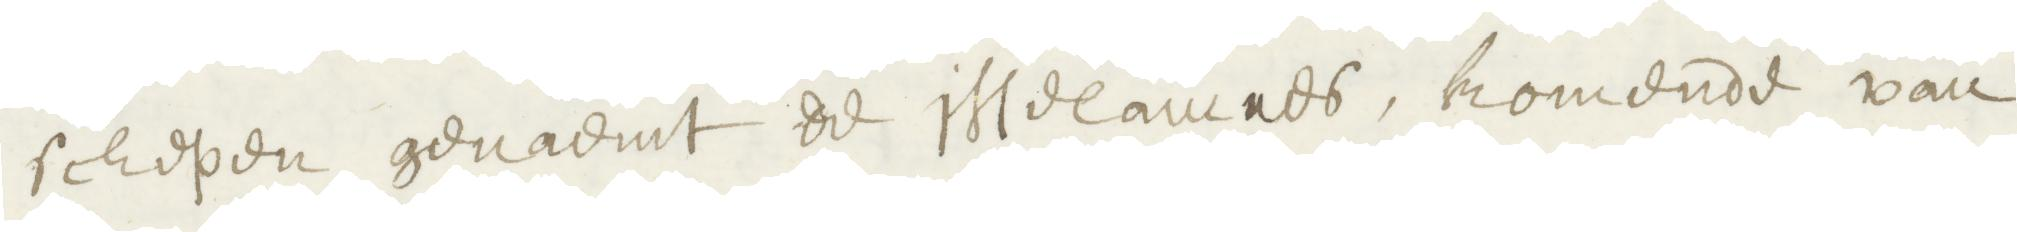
schepen genaemt de isselamres, komende van
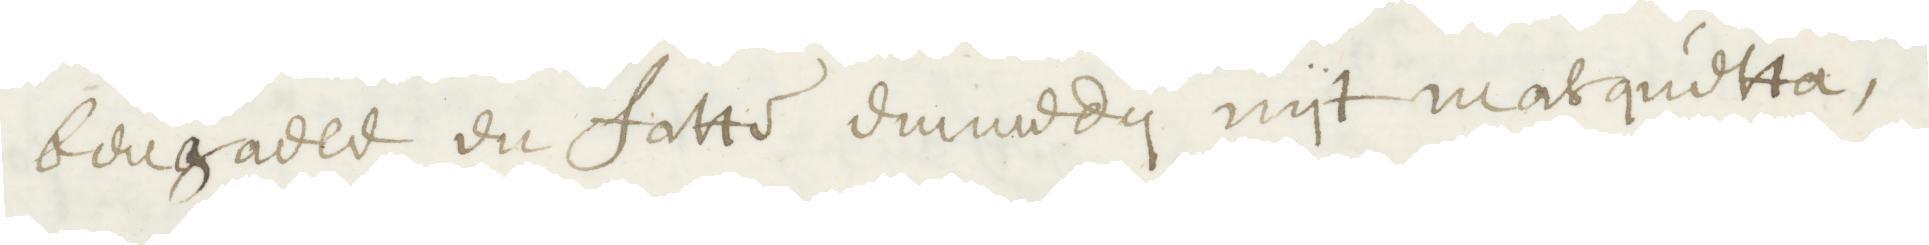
bengaele en fatte emmedij uijt masquetta,
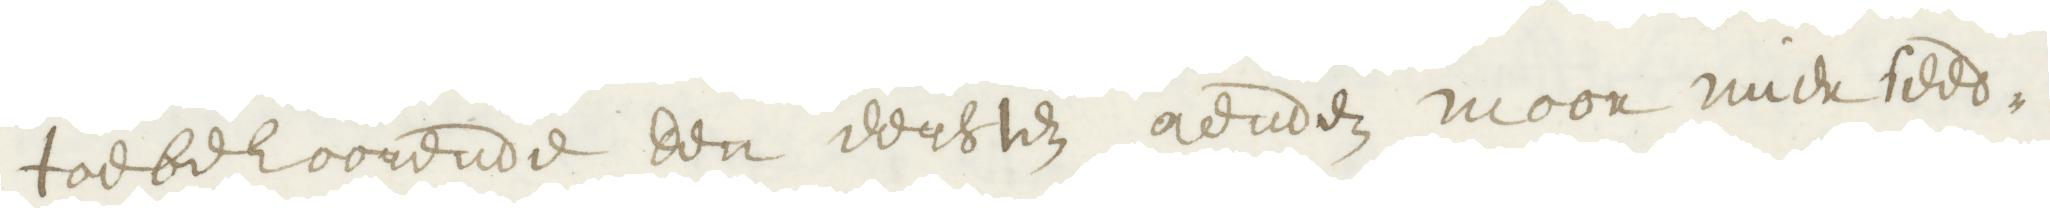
toebehoorende den eersten aenden moor mier seed„
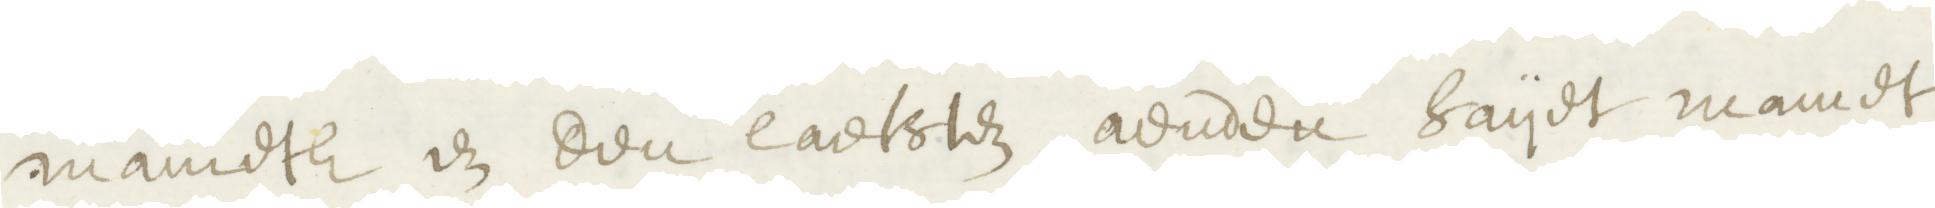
mameth en den laetsten aenden saijet mamet
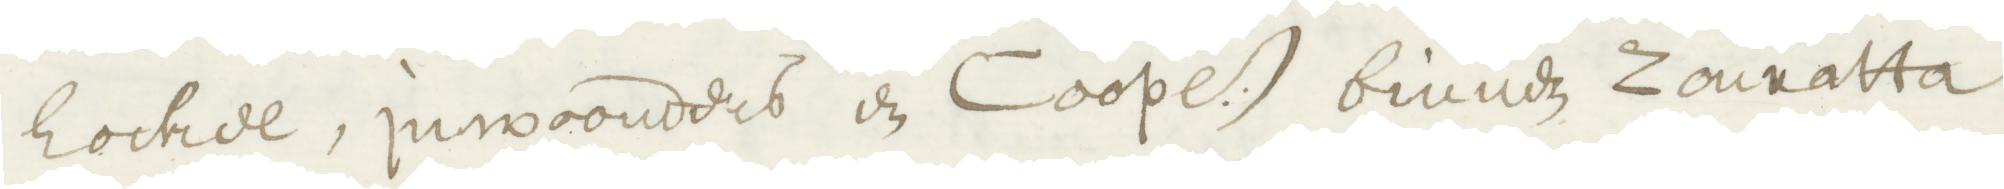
hockel, inwoonders en Cooplijk: binnen Zouratta
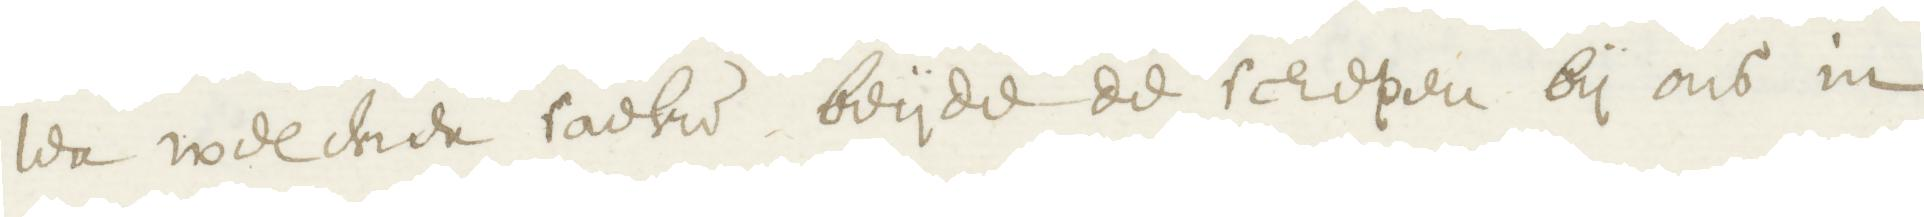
ter welcker saeke beijde de schepen bij ons in
